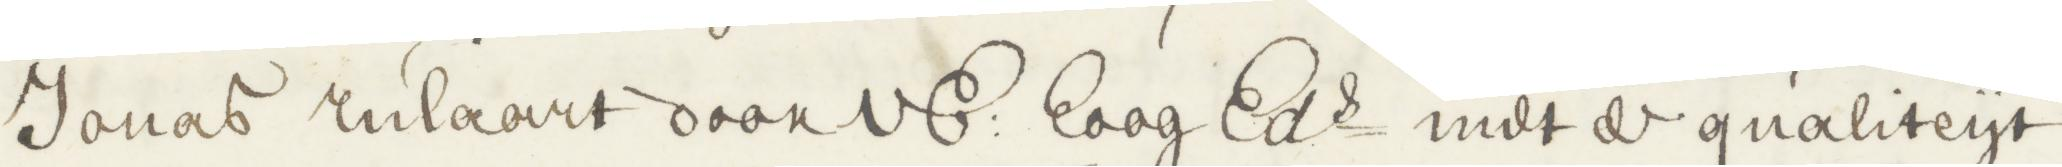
Jonas rulaart door VE: Hoog Ed=s met de qualiteijt
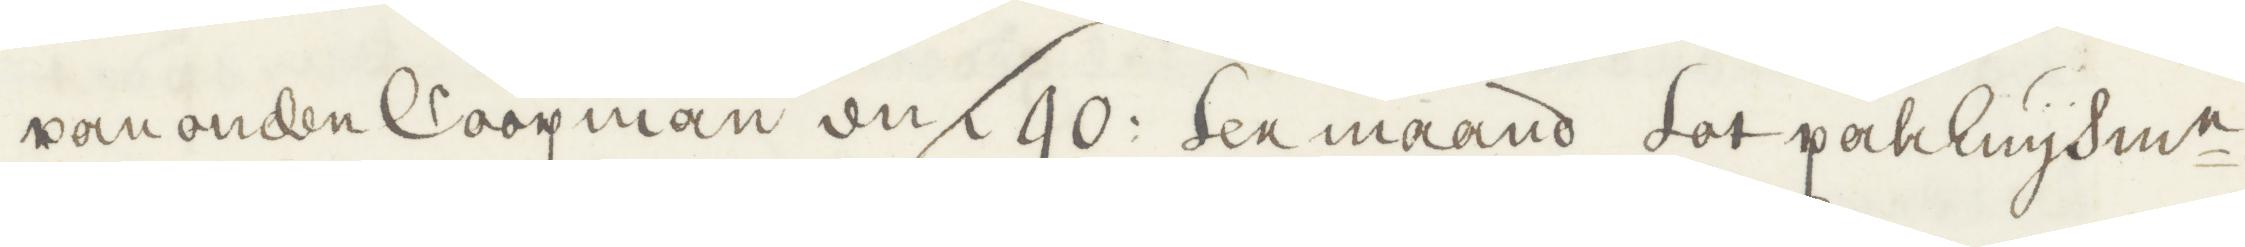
van onder Coopman en ƒ40: ter maand tot pakhuijsm=r
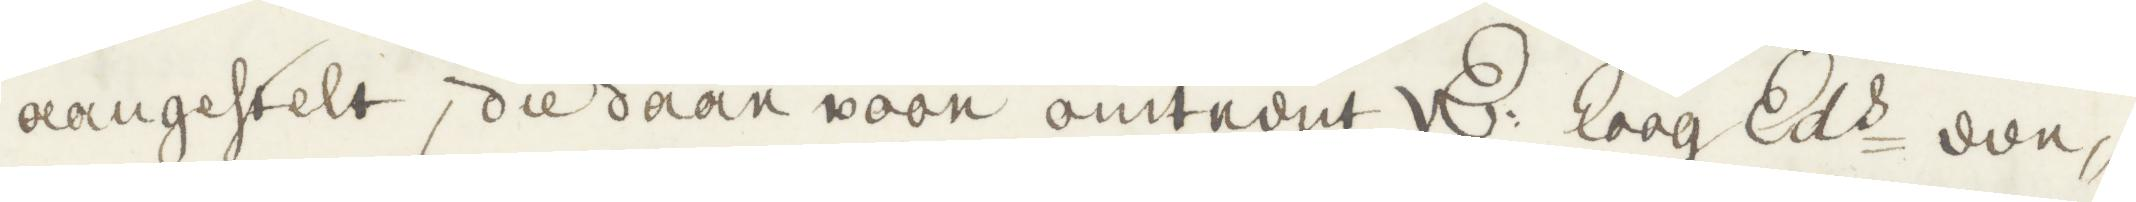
aangestelt, die daar voor omtrent VE: Hoog Ed=s eer„
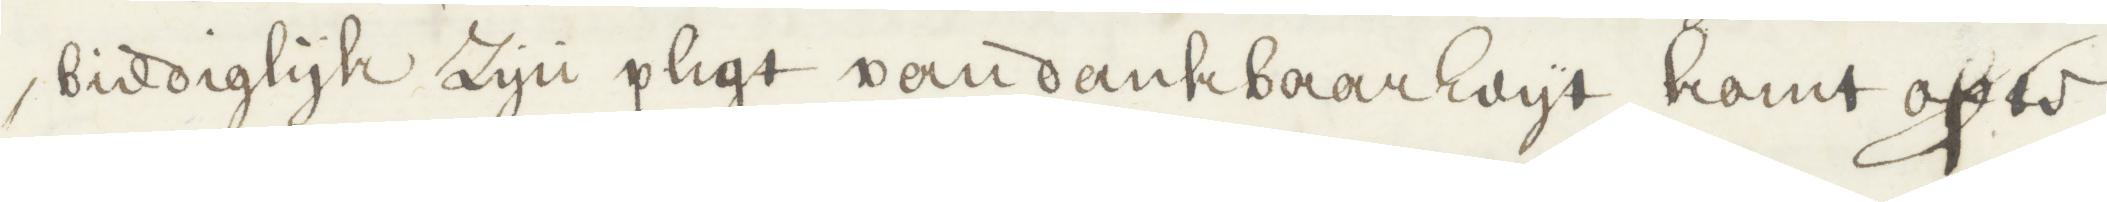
„biediglijk zijn pligt van dankbaarheijt komt op te
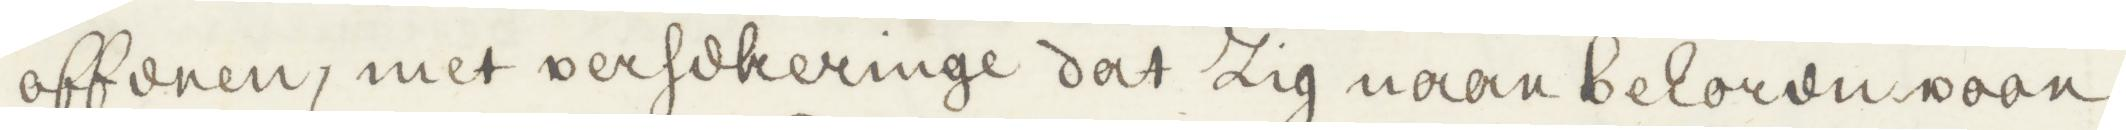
offeren, met versekeringe dat zig naar behoren voor
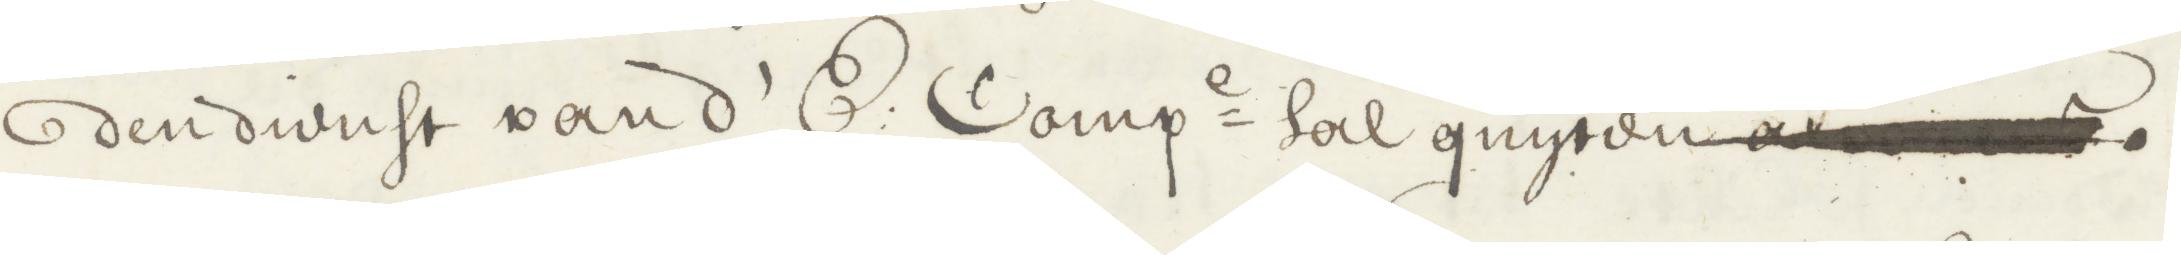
den dienst van d’ E: Comp=e sal quijten alvorens.
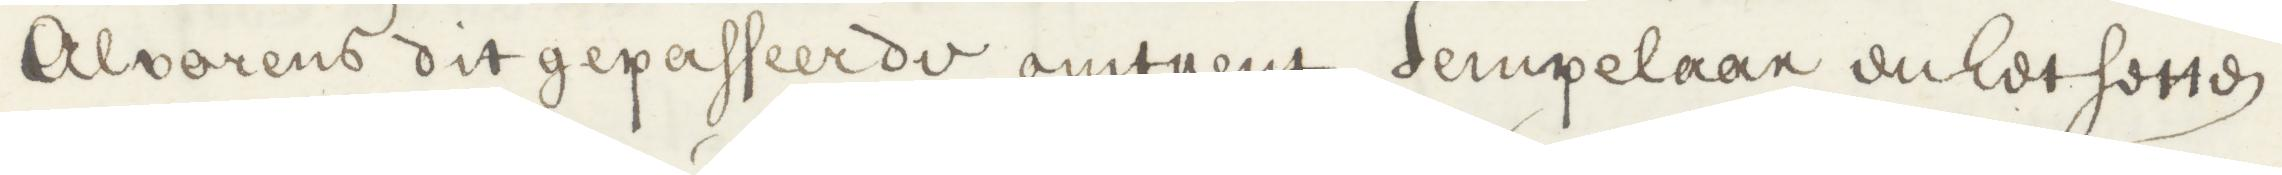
Alvorens dit gepasseerde omtrent tempelaar en het setten
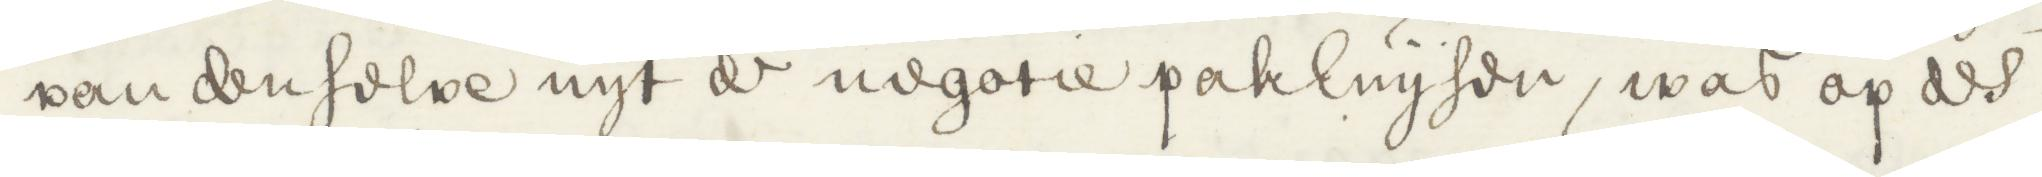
van denselve uijt de negotie pakhuijsen, was op des
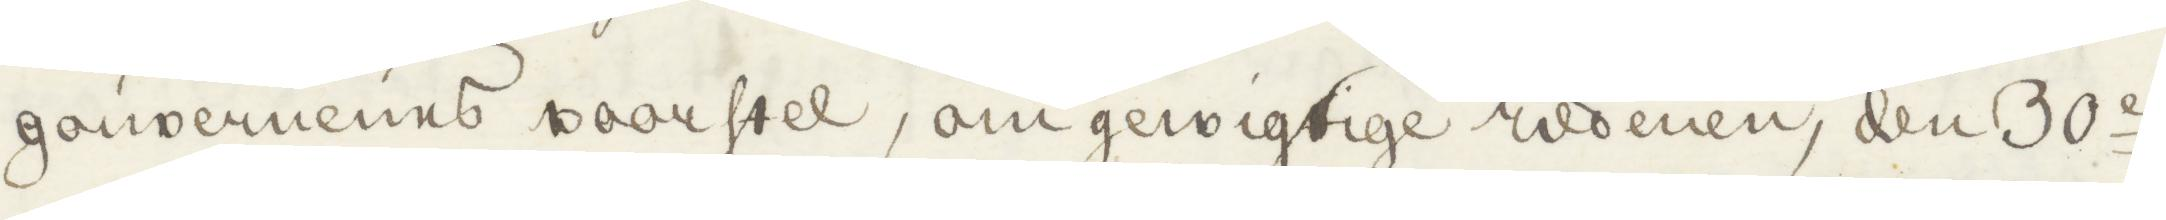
gouverneurs voorstel, om gewigtige redenen, den 30=e
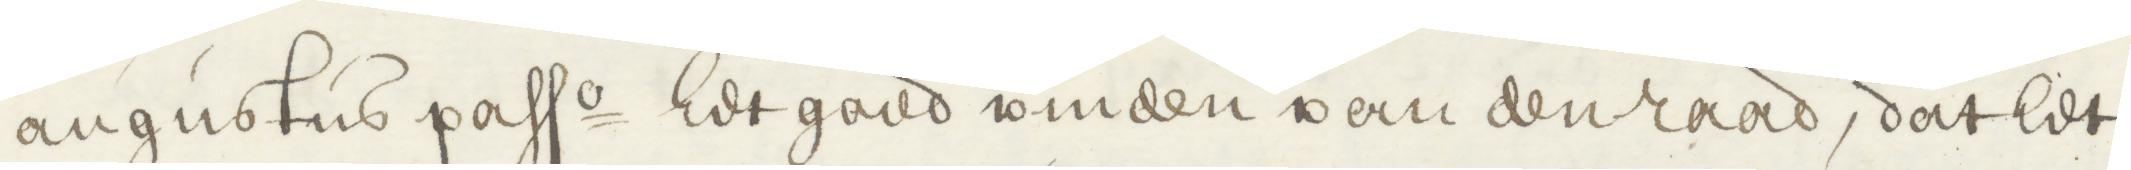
augustus pass=o het goed vinden van den raad, dat het
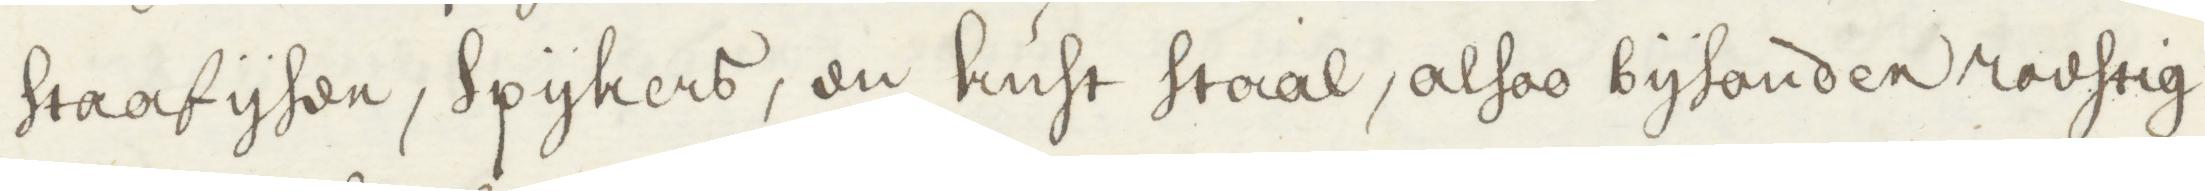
staafijser, spijkers, en kust staal, alsoo bijsonder roestig
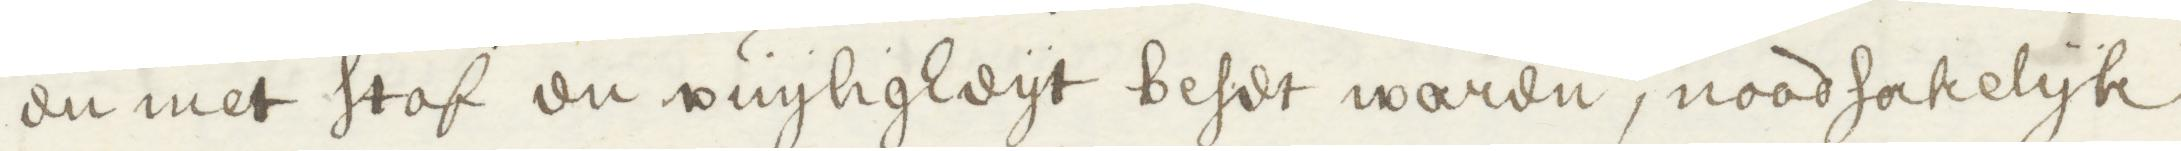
en met stof en vuijligheijt beset waren, noodsakelijk
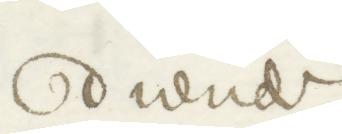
diende
